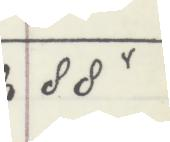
885
